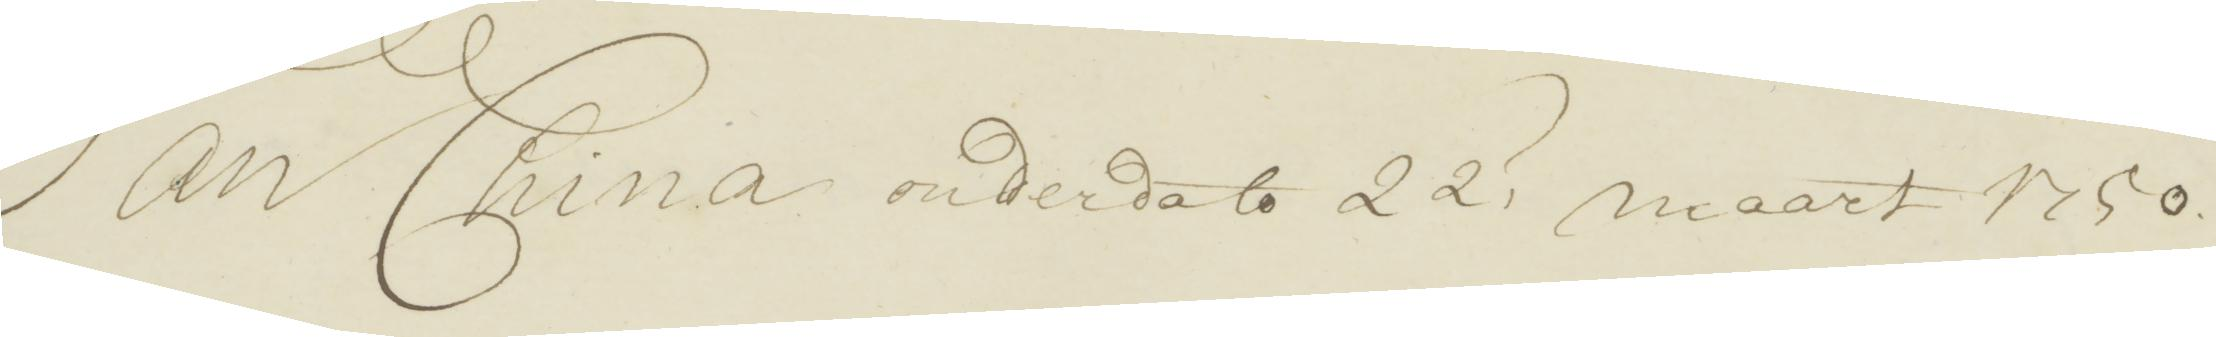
Van China onder dato 22:' maart 1750.
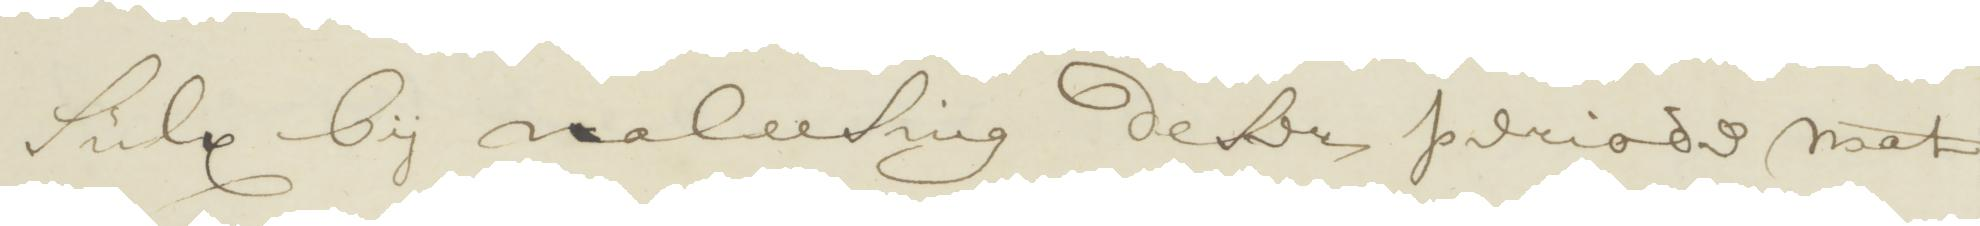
sulx bij naleesing deser periode wat
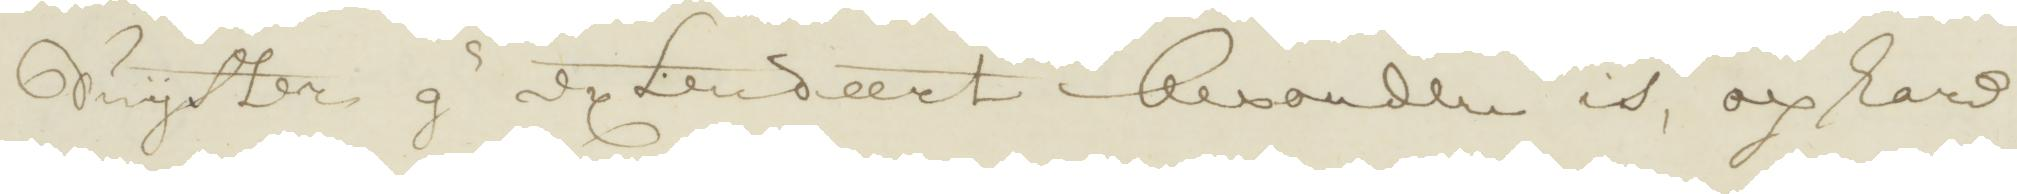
duijster g’extendeert bevonden is, op hare
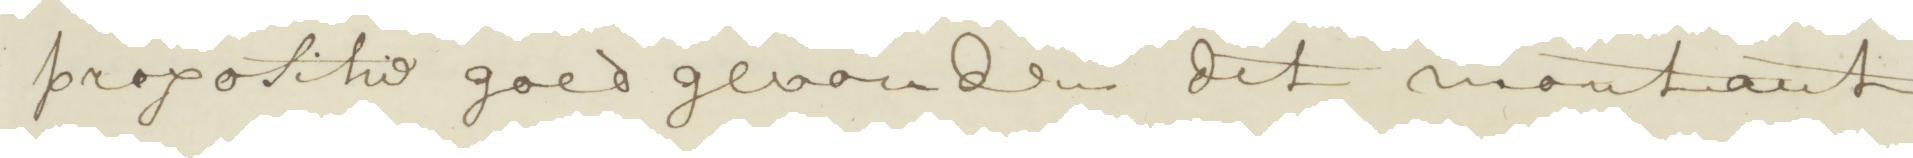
propositie goed gevonden dit montant
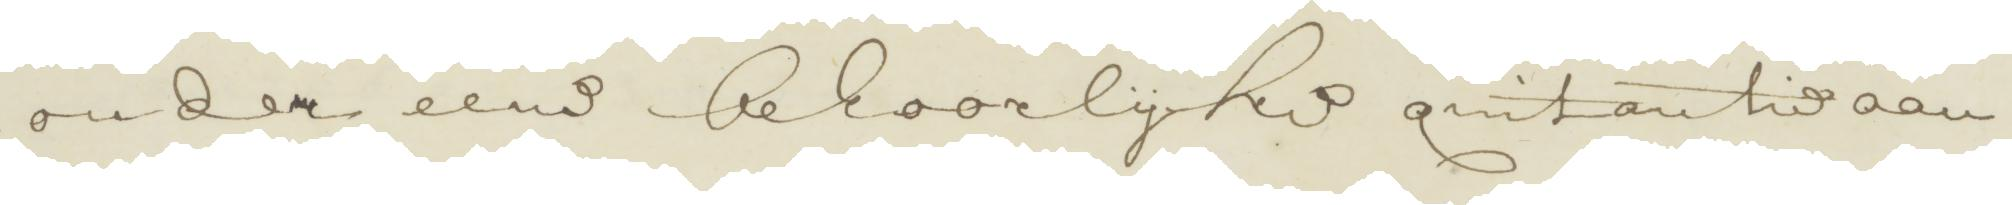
onder eene behoorlijke quitantie aan
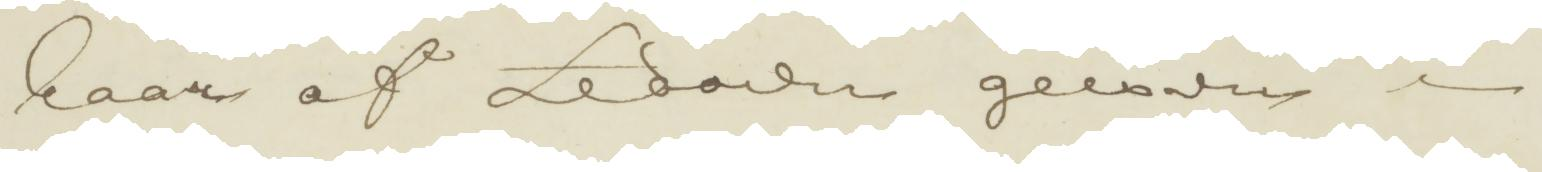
haar af tedoen geeven —
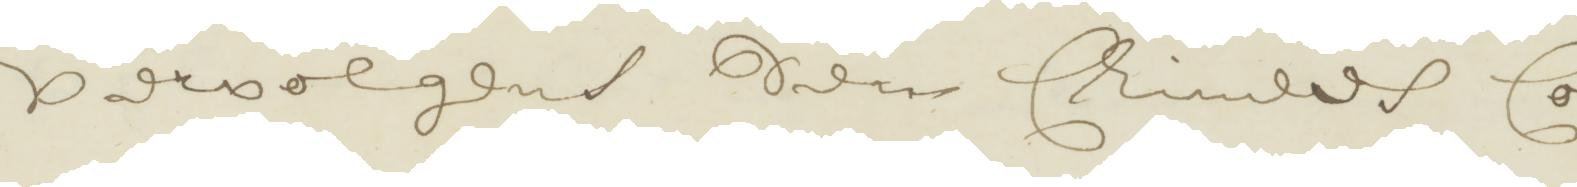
vervolgens den Chinees Co
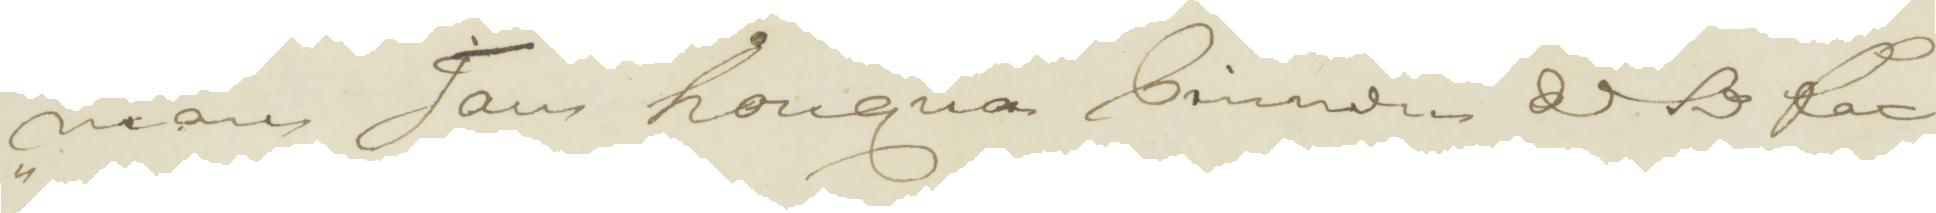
„man Jan honqua binnen dese fac
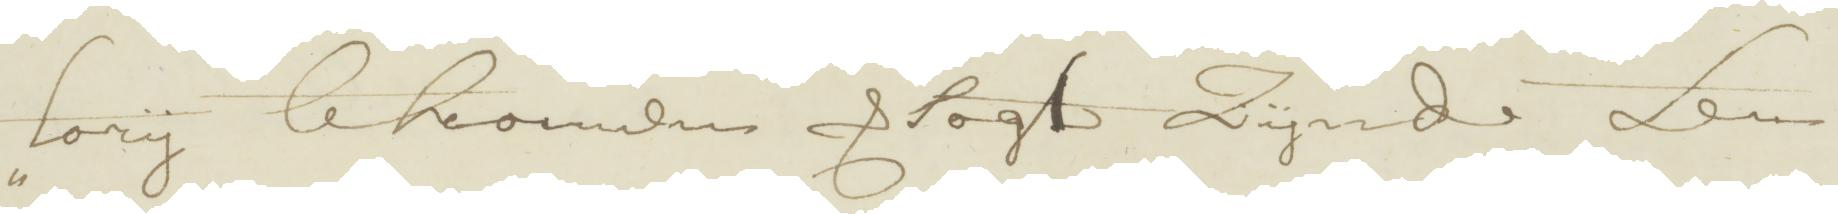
„torij tekomen versogt zijnde ten
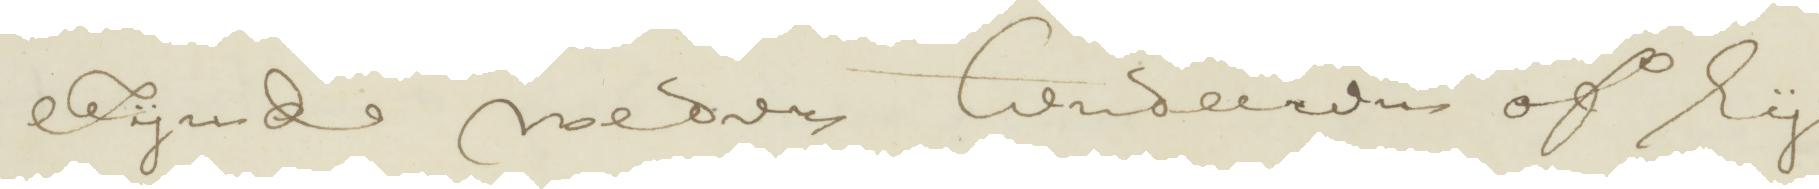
Eijnde weder tendeeren of hij
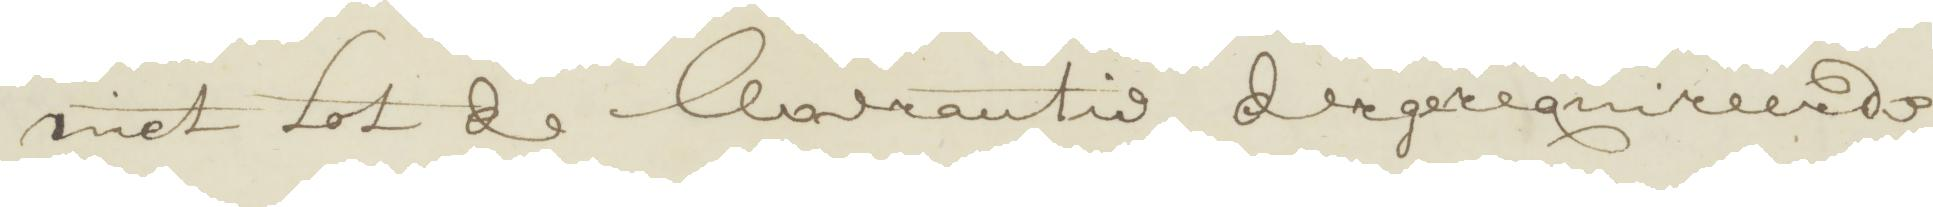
niet tot de leverantie der gerequireerde
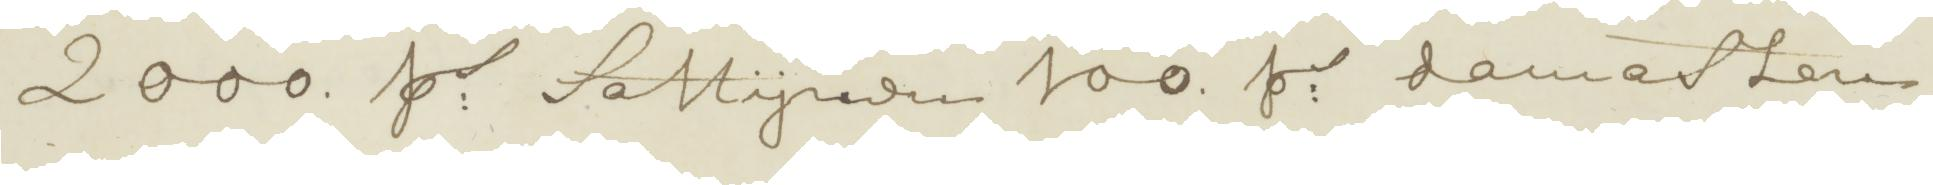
2000. p:s sattijnen 100. p:s damasten
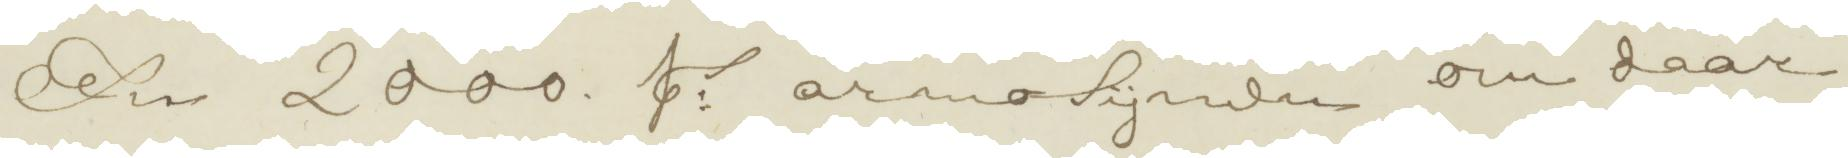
En 2000. p:s armosijnen om daar
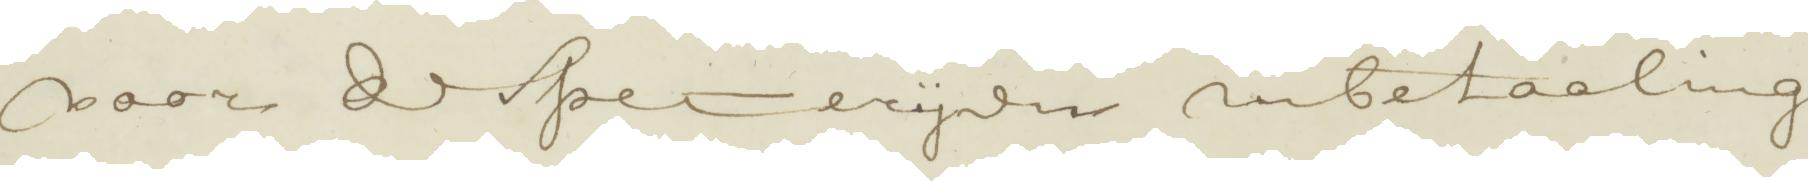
voor de specerijen inbetaaling
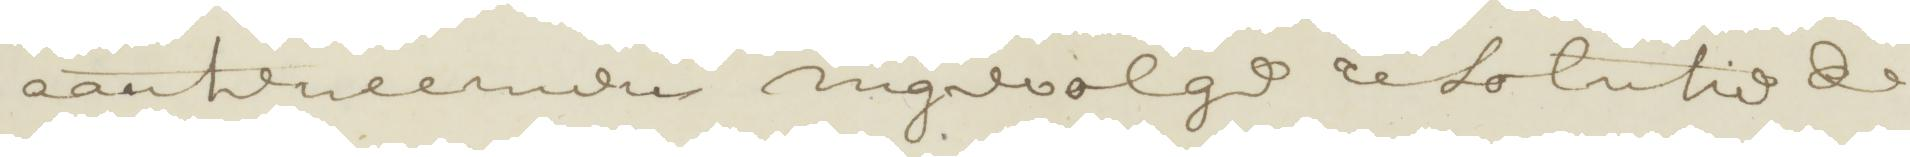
aanteneemen ingevolge resolutie de
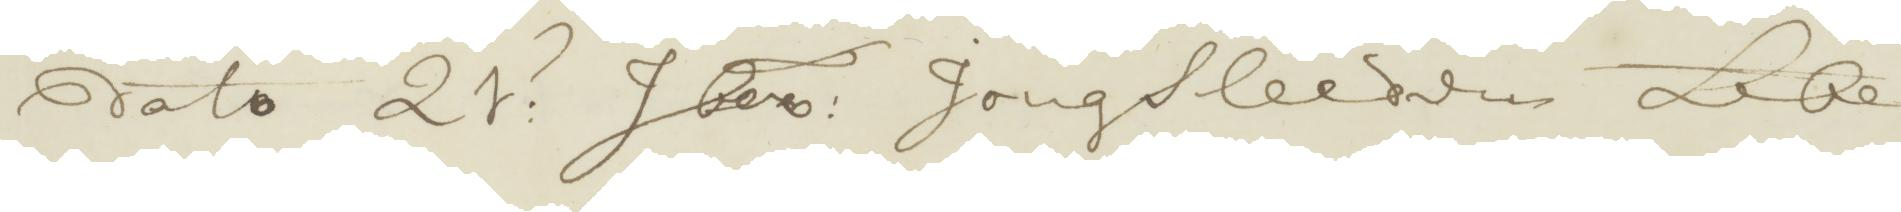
dato 21:' 7ber: jongsleeden te be
